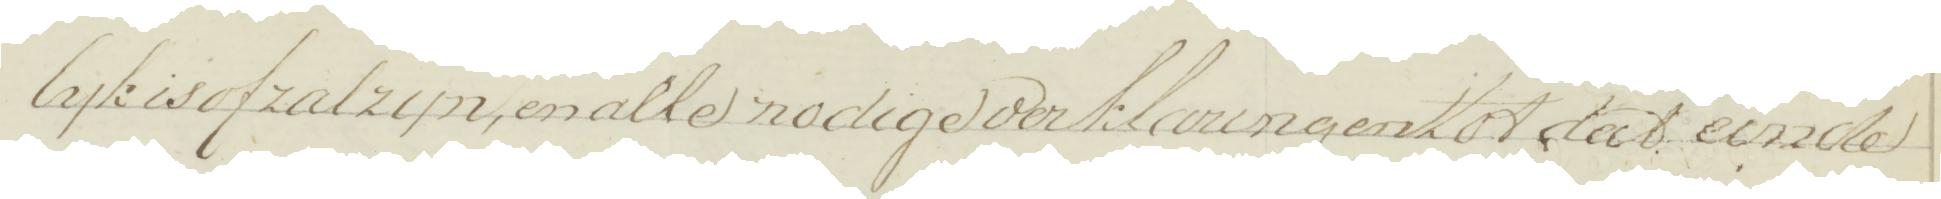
lyk is of zal zyn, en alle nodige verklaringen tot dat einde
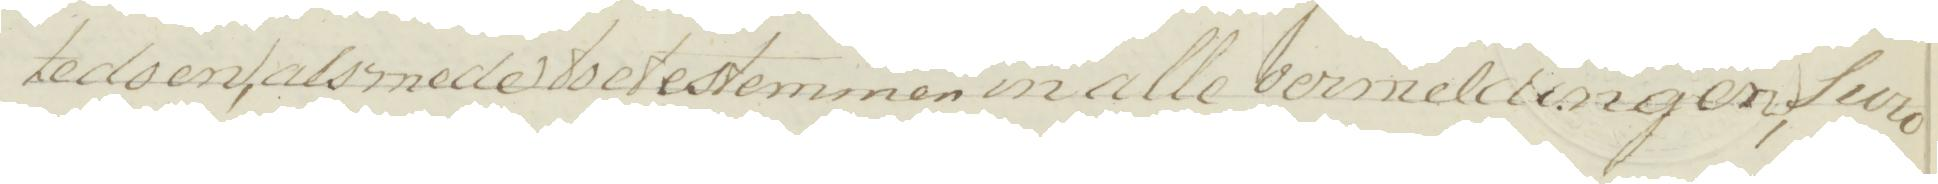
te doen, alsmede toetestemmen in alle vermeldingen, suro
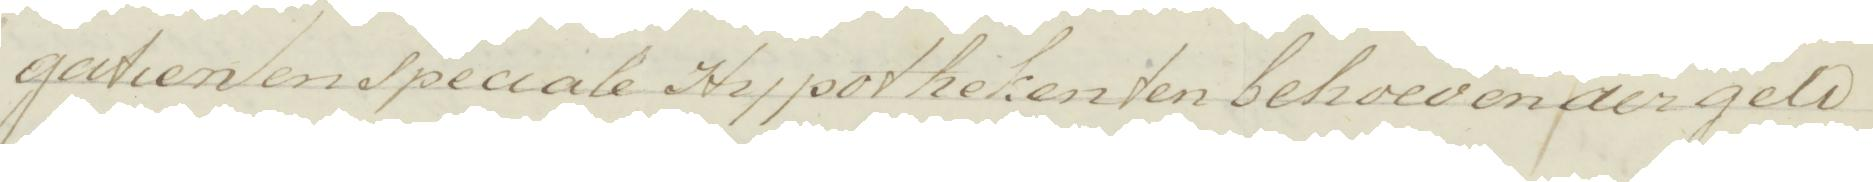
gatien en speciale Hypotheken ten behoeven der geld
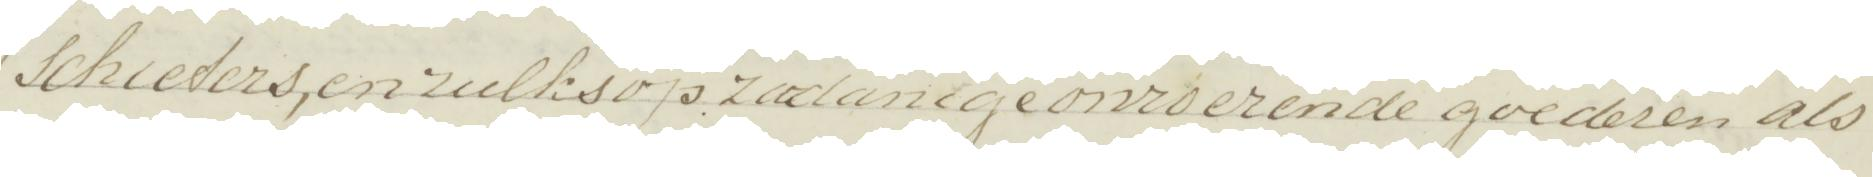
schieters, en zulks op zodanige onroerende goederen als
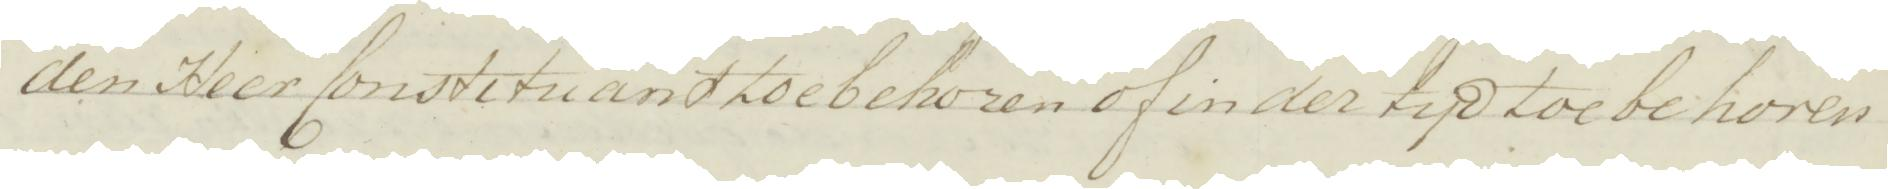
den Heer Constituant toebehoren of in der tyd toebehoren
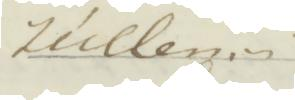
zullen. –
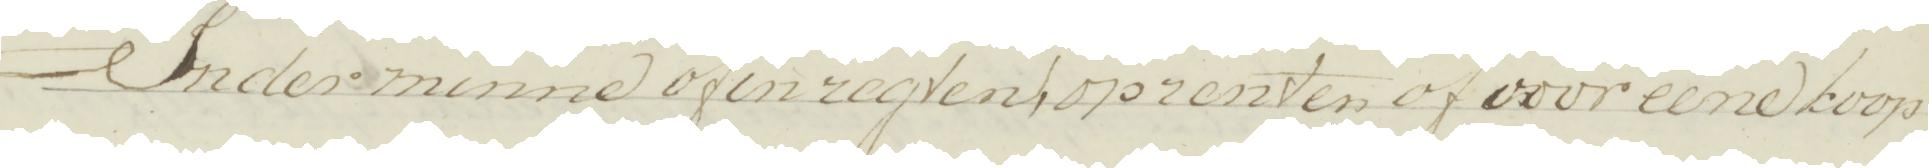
In der minne of in regten, op renten of voor eene koop
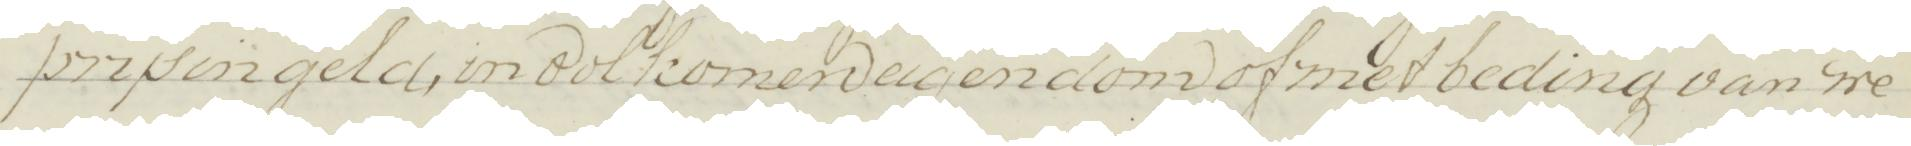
prys in geld, in volkomen eigendom of met beding van we
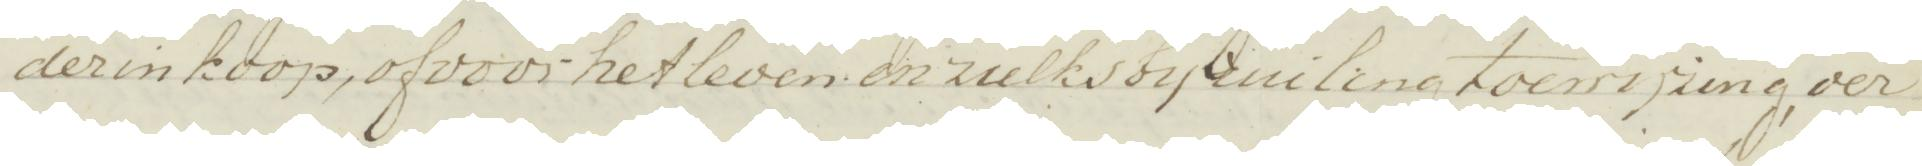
der in koop, of voor het leven en zulks by ruiling, toewyzing, ver
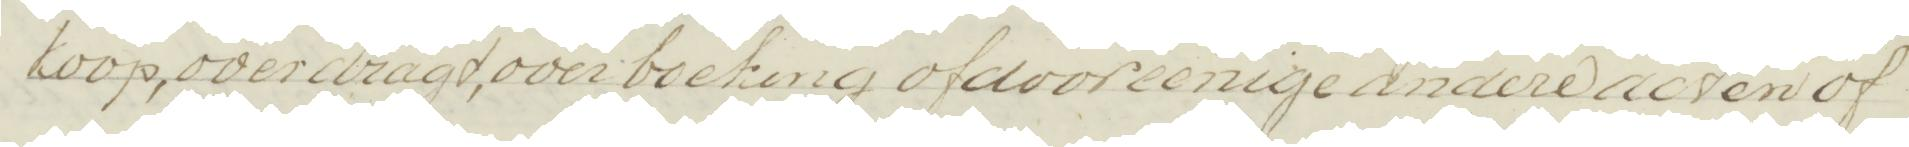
koop, overdragt, overboeking of door eenige andere acten of
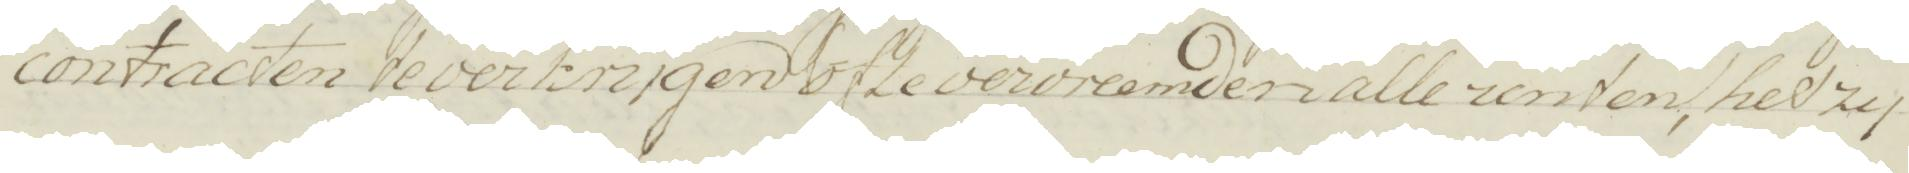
contracten te verkrygen of te vervreemden alle renten, het zy
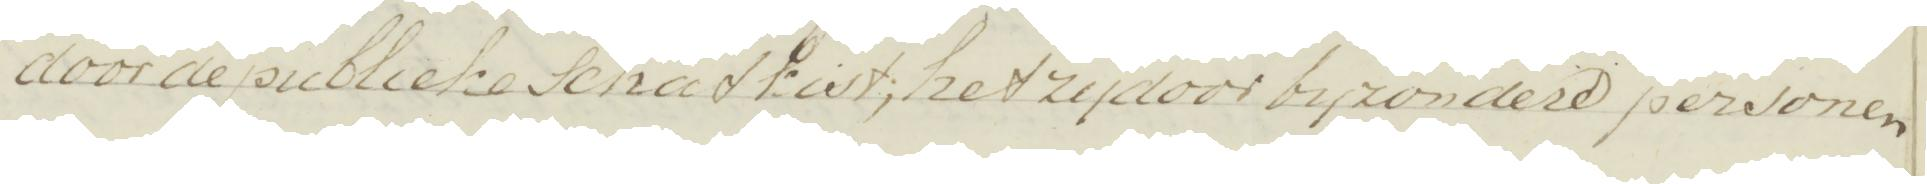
door de publieke schatkist, het zy door byzondere personen
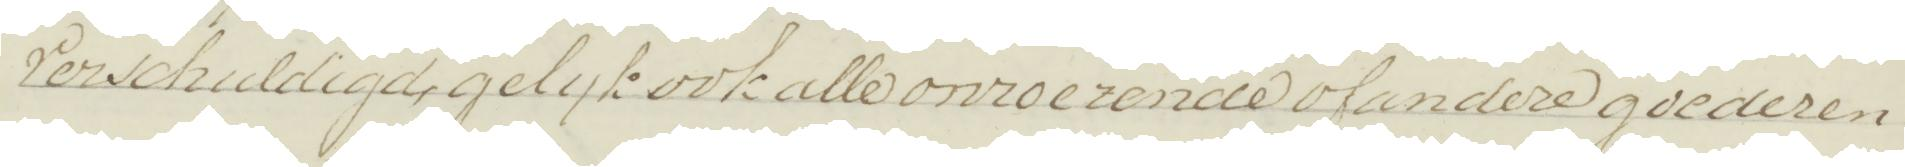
Verschuldigd, gelyk ook alle onroerende of andere goederen
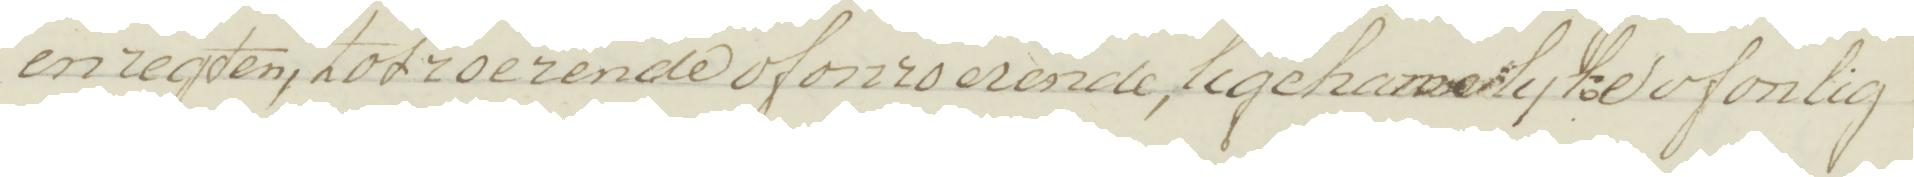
en regten, tot roerende of onroerende, ligchamelyke of onlig
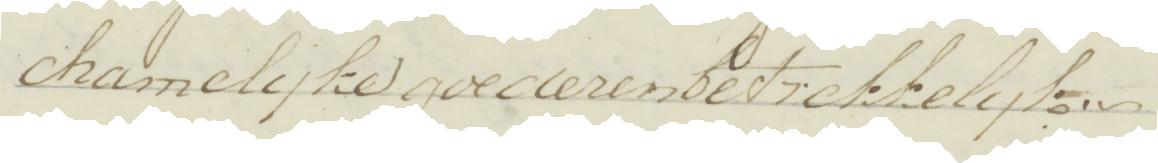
chamelyke goederen betrekkelyk. –
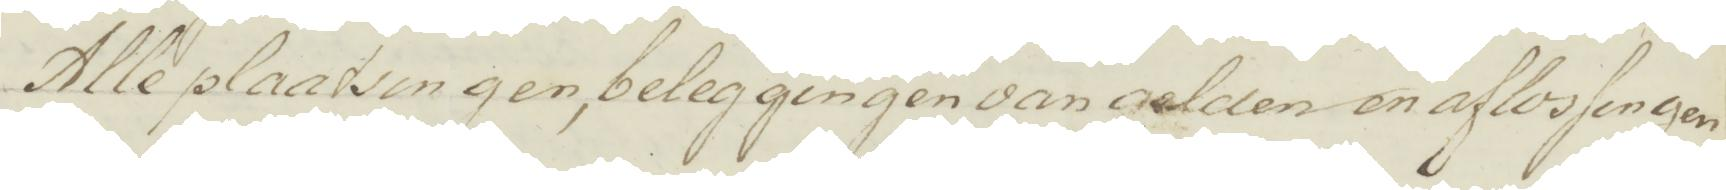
Alle plaatsingen, beleggingen van gelden en aflossingen,
